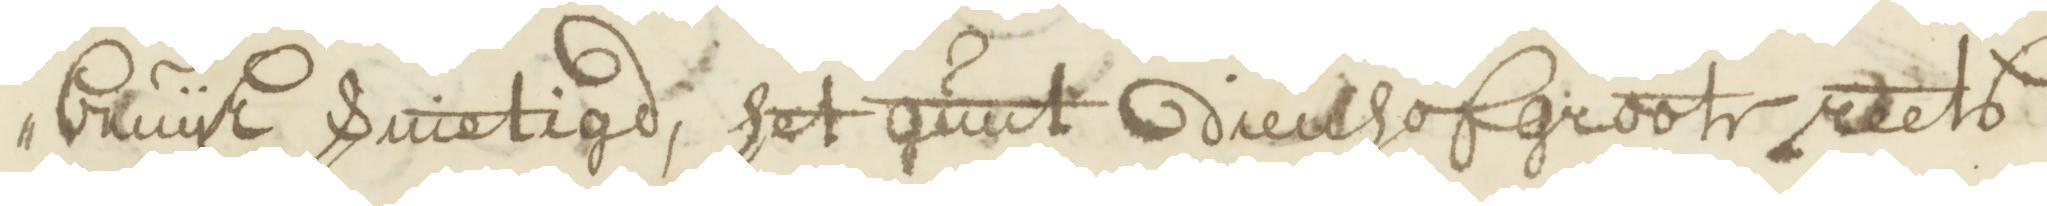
„bruijk vernietigd; het gunt dienhof groote reets
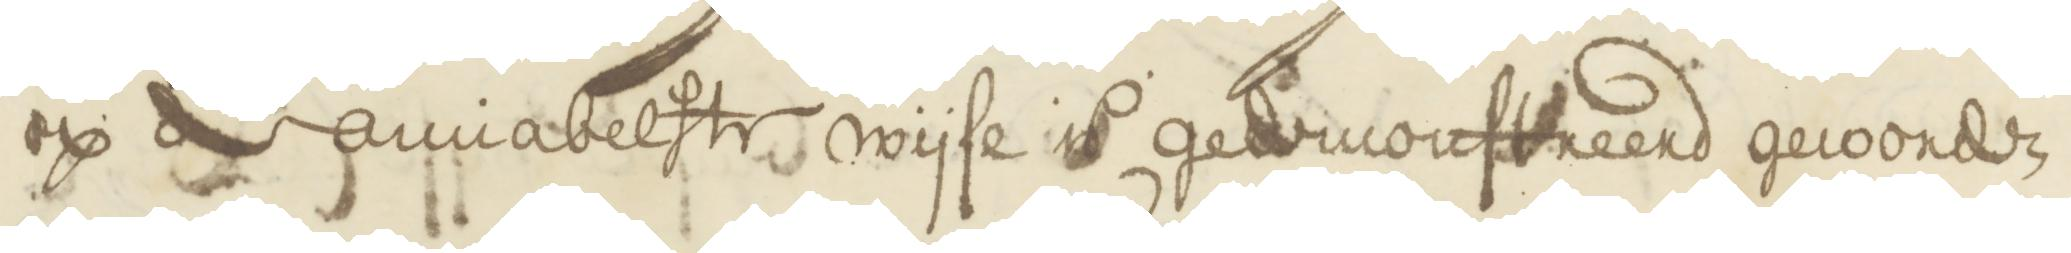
op de amiabelste wijse is gedemonstreerd geworden
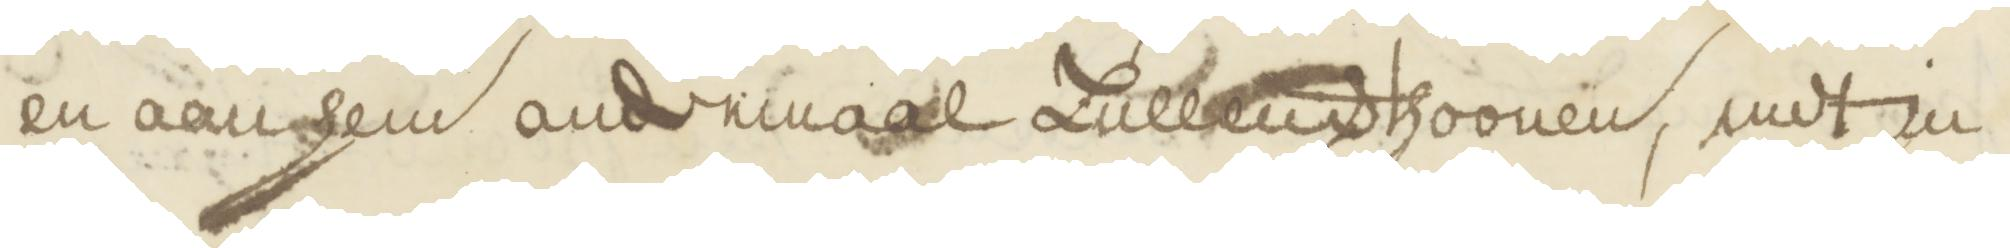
en aan hem andermaal zullen verthoonen, met in
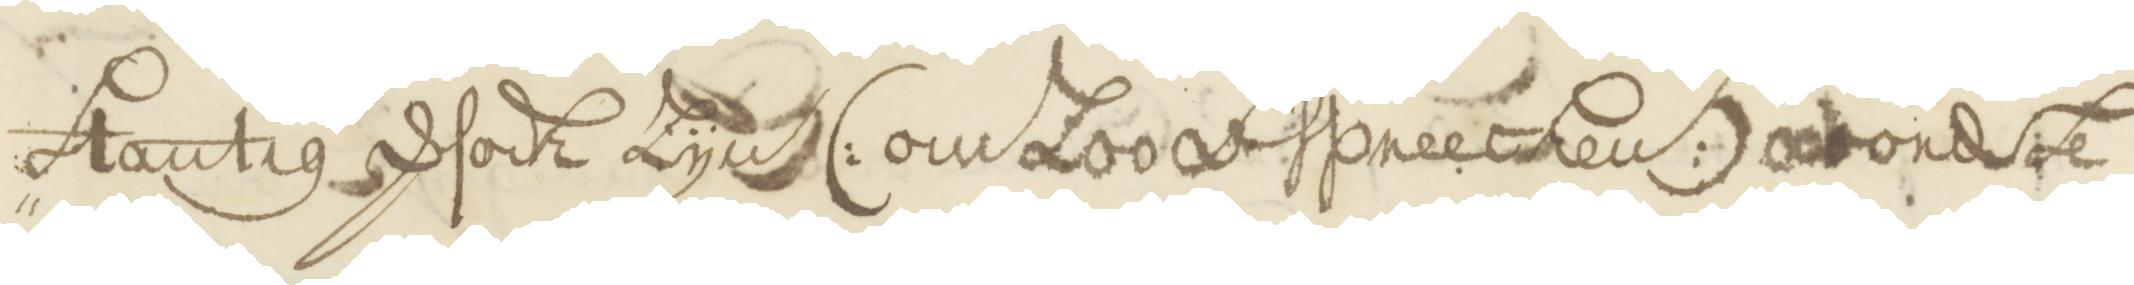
„stantig versoek zijn (:om zoo tespreecken:) voordese
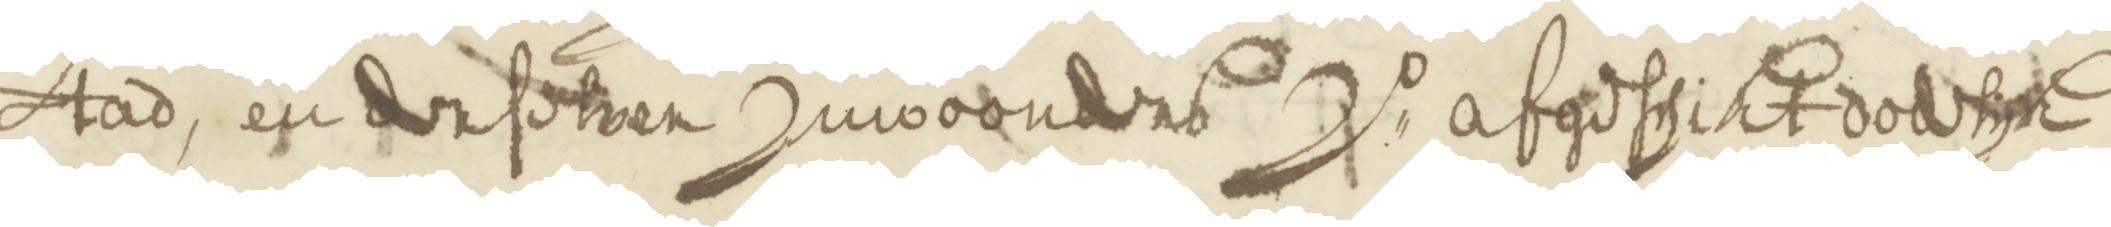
stad, en derselver jnwoonders j„o afgeschikt dodelyk
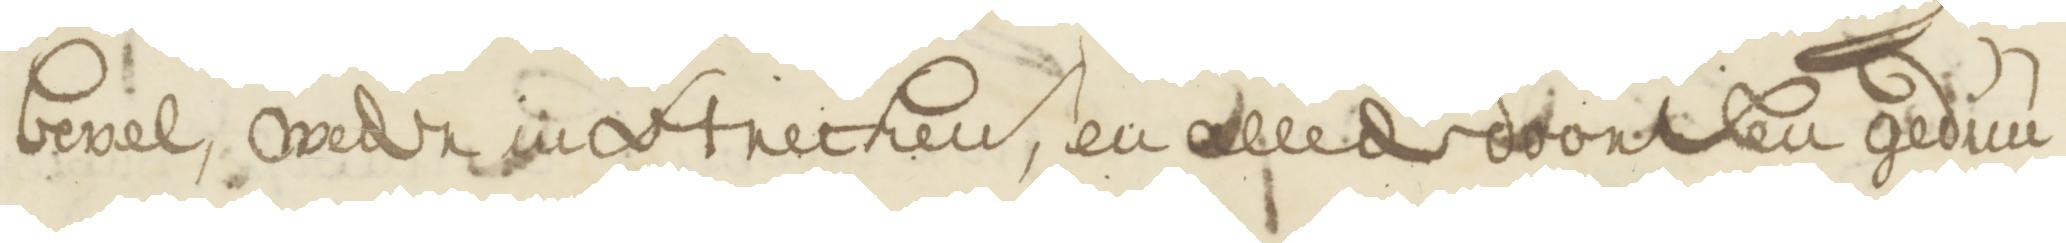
bevel, weder in tetrecken, en alle de door Een geduu
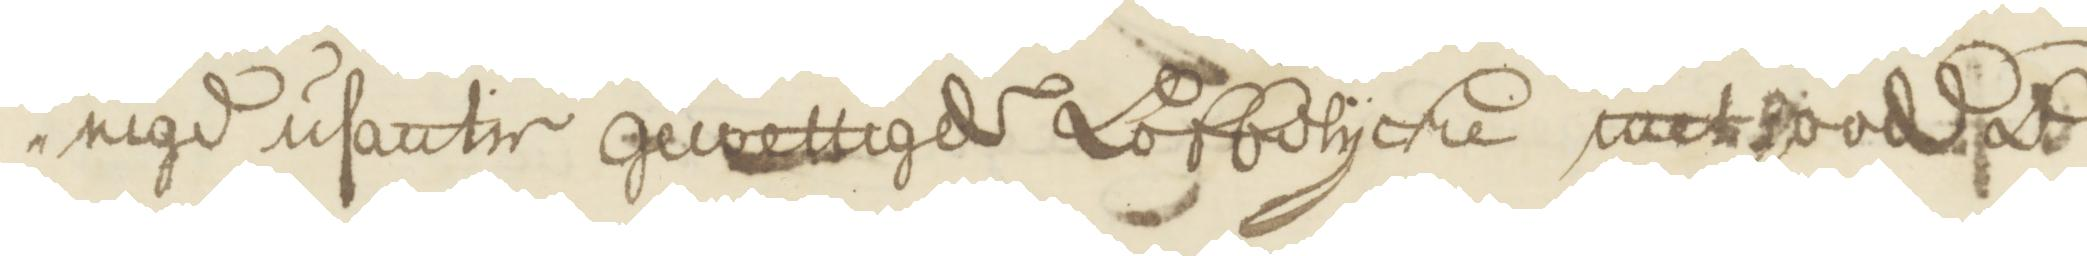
„rige usantie gewettigde Loffelijcke methoode te
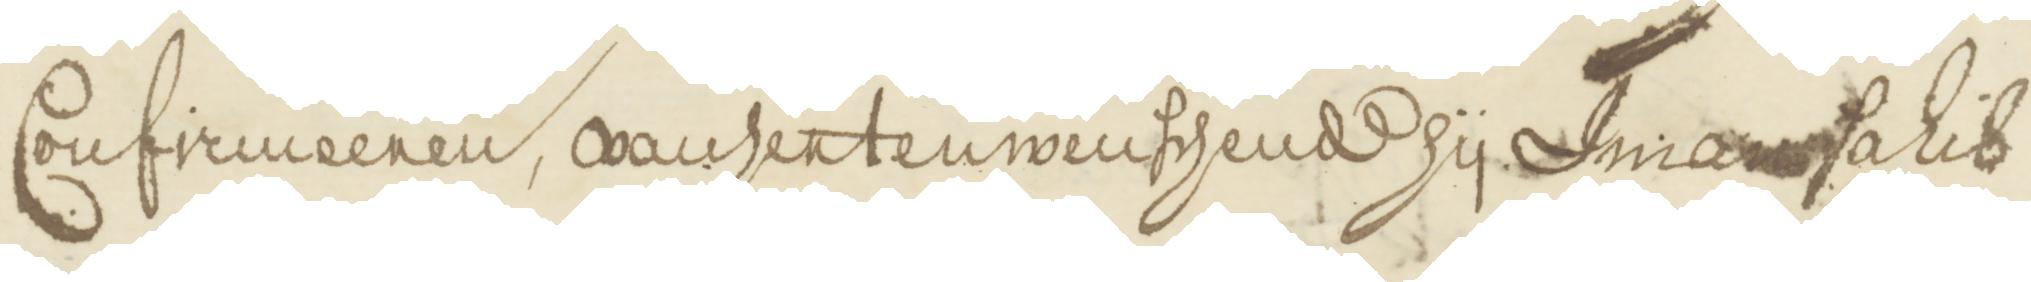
Confirmeeren, vanherten wenschende hij Jman sahib
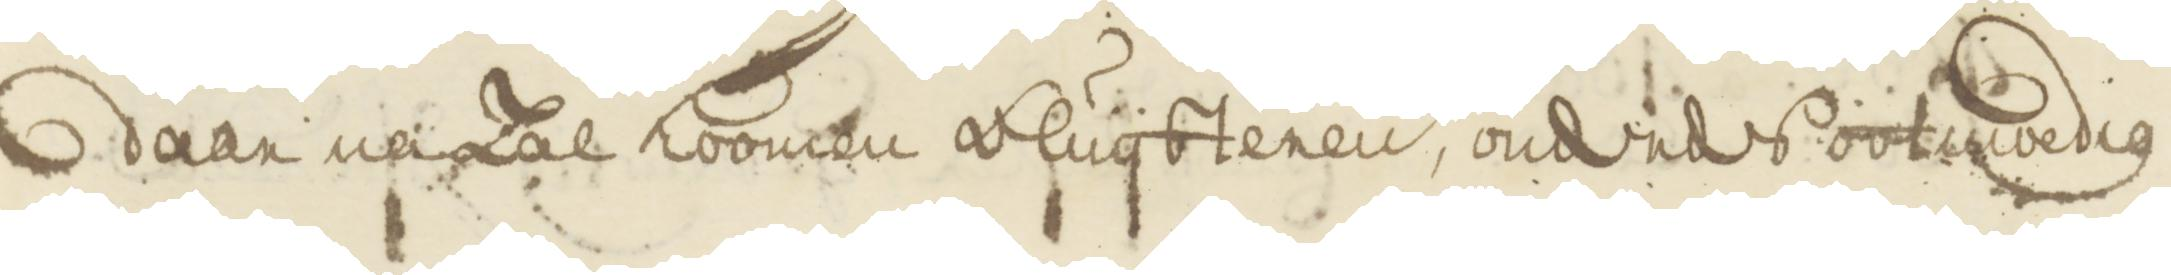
daar na zal koomen te luijsteren, onderdes ootmoedig
